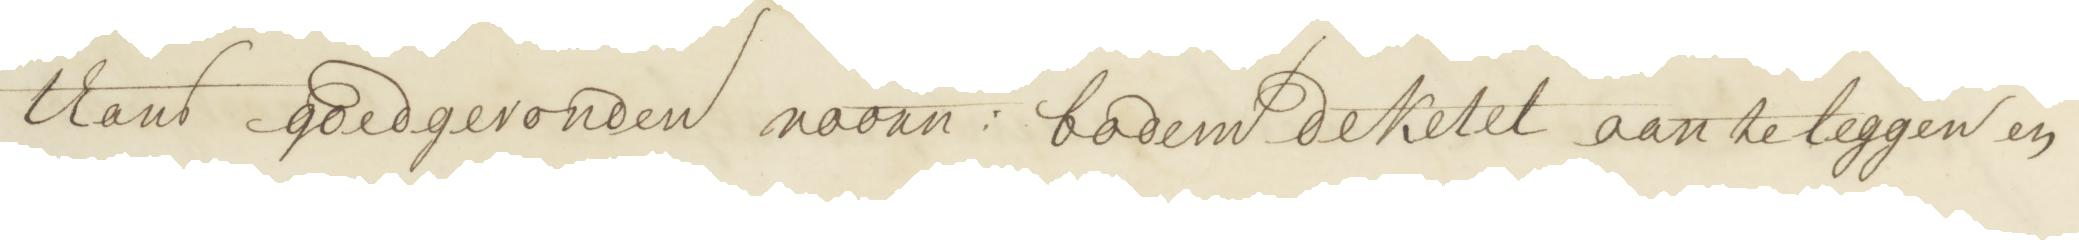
thans goedgevonden voorn: bodem de ketel aan te leggen en
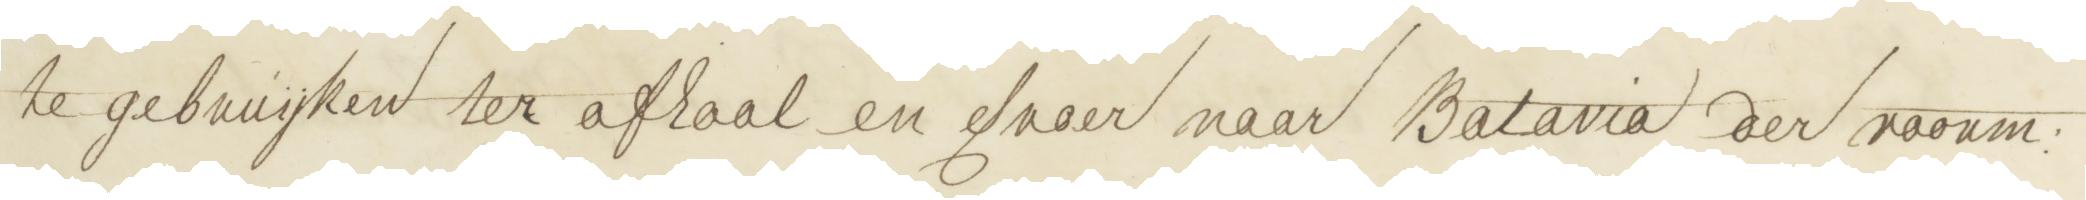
te gebruijken ter afhaal en vervoer naar Batavia der voorm:
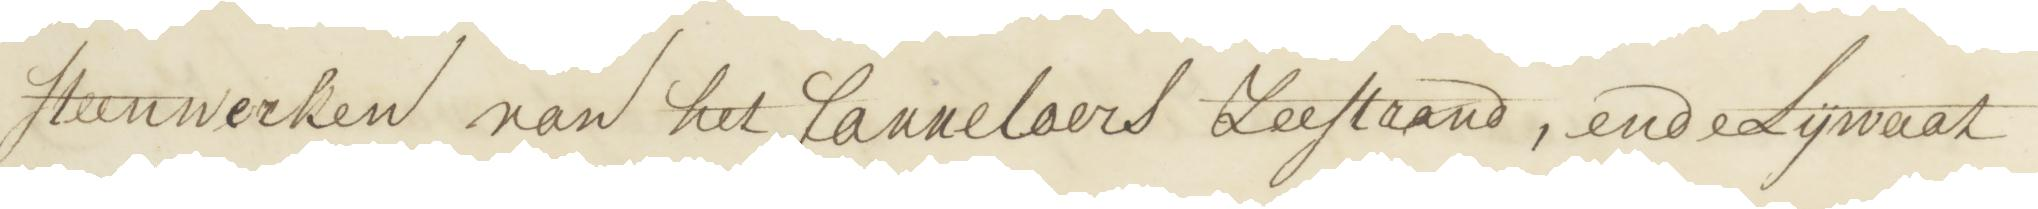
steenwerken van het Carreloers Zeestrand, ende Lijwaat
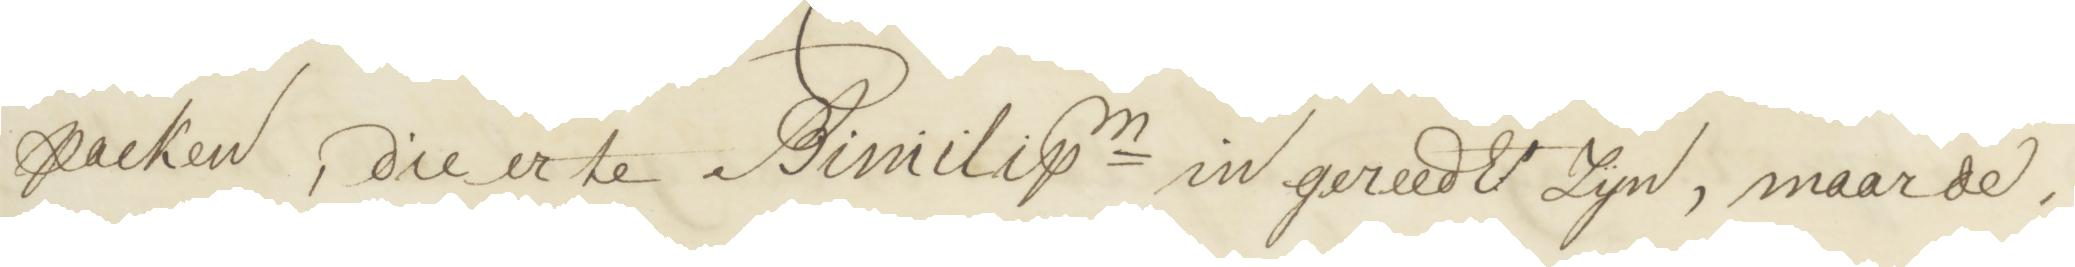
packen, die er te Bimilip=m in gereedh:t zijn, maar de,
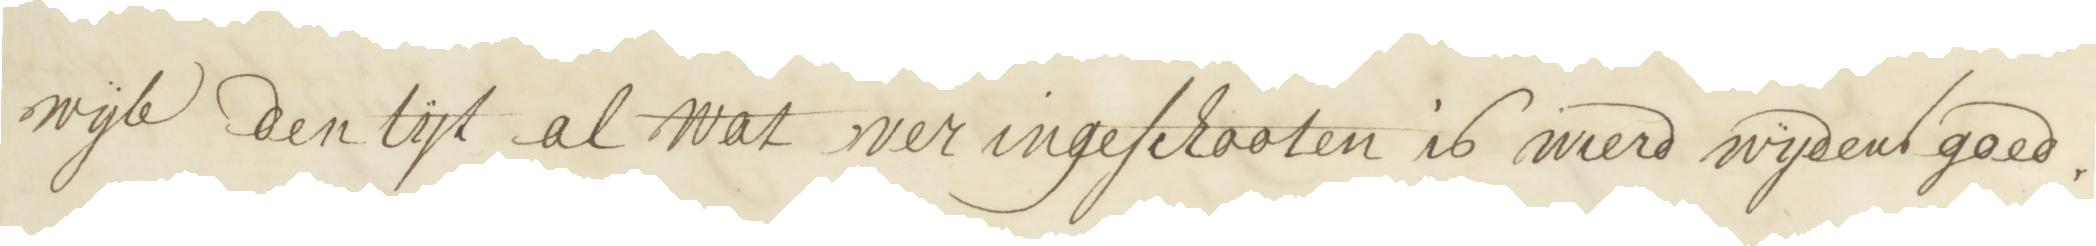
wijl den tijt al wat ver ingeschooten is wierd wijders goed,
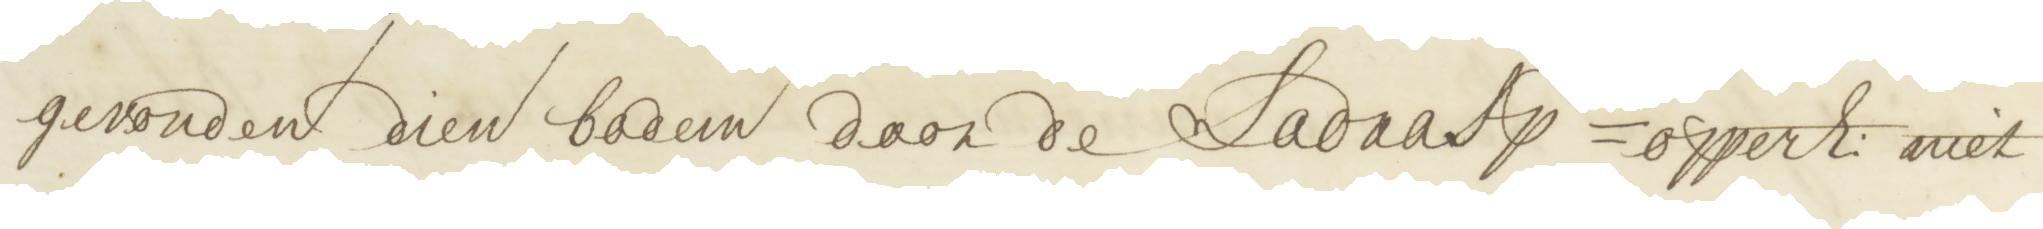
gevonden dien bodem door de Ladrasp=te opperh: niet
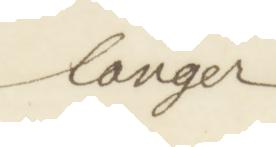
langer
